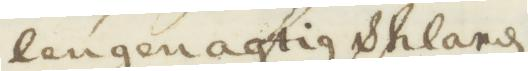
leugenagtig verklaren
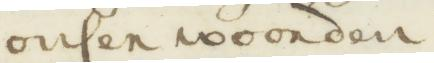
onser woorden
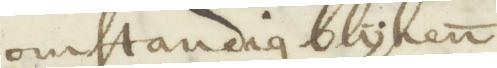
omstandig blijken
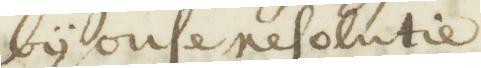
bij onse resolutie
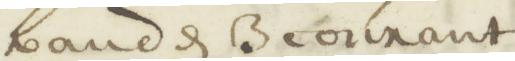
van den 3 courant
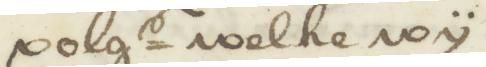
volg=s welke wij
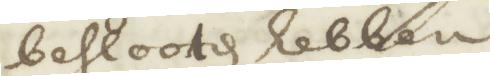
beslooten hebben
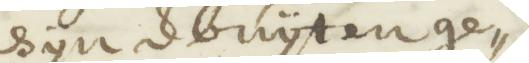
sijn E buijten ge„
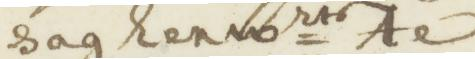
sag herw=rts te
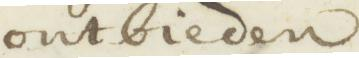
ontbieden
